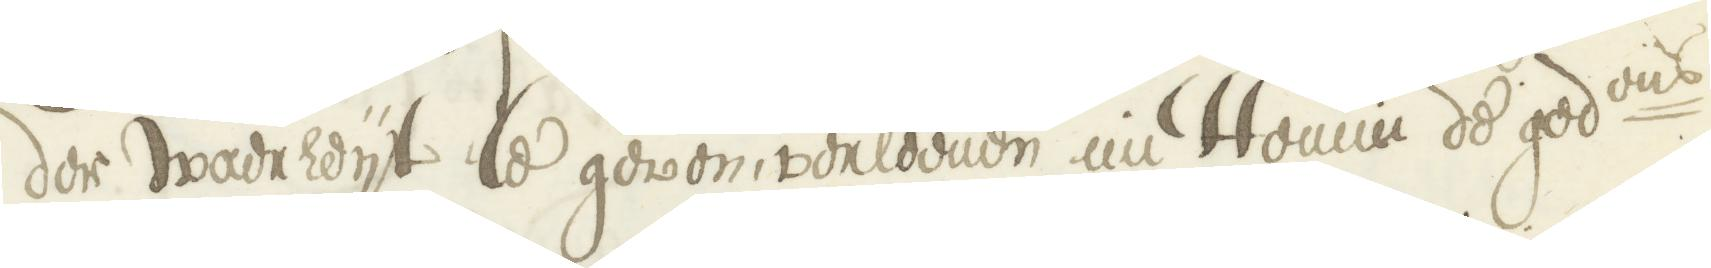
der Waerheijt te geven, verleenen niettemin de ged=ens
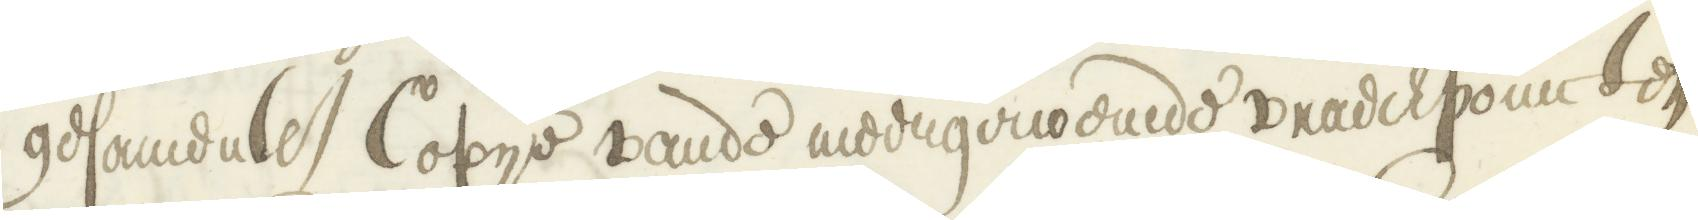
gesamentl/ Copije vande meergenoemde vraechpoincten
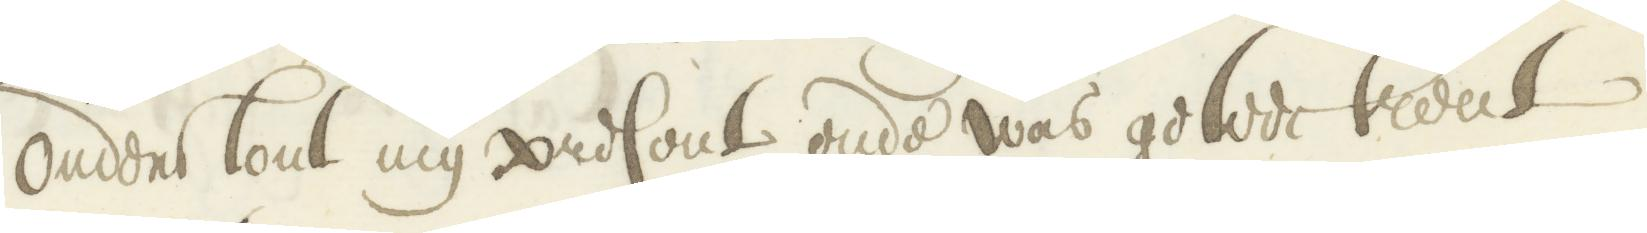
onderstont mij present ende was geteeckent
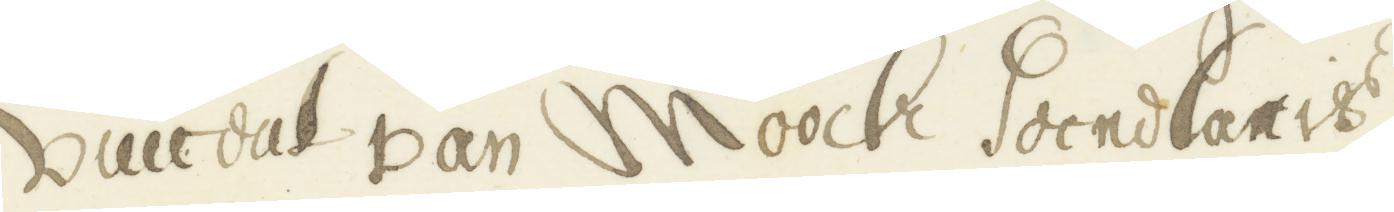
Vincent van Moock Secretaris
